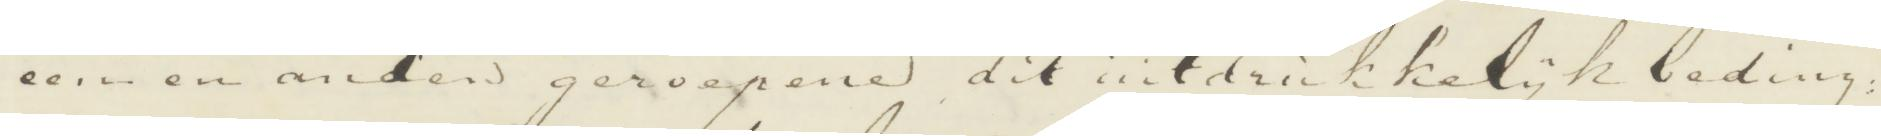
een en ander geroepene, dit uitdrukkelijk beding:
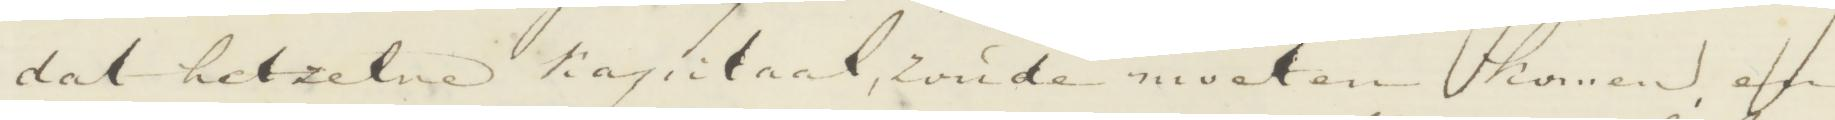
dat hetzelve kapitaal, zoude moeten komen, en
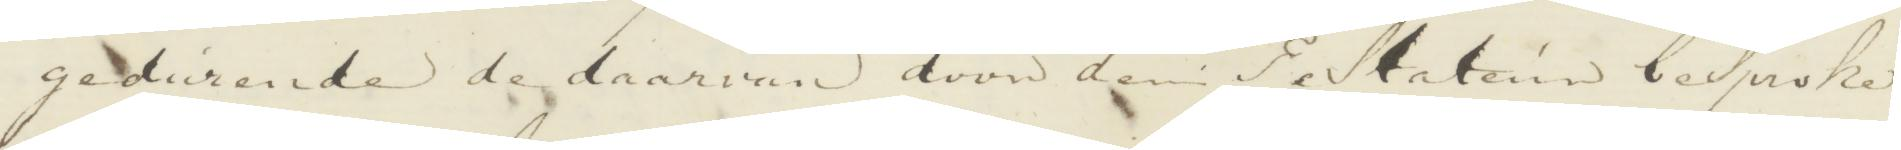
gedurende de daarvan door den Testateur besproke
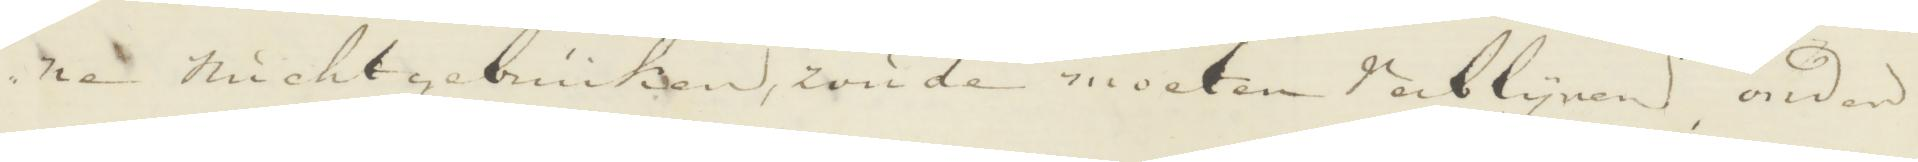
„ne vruchtgebruiken, zoude moeten verblijven, onder
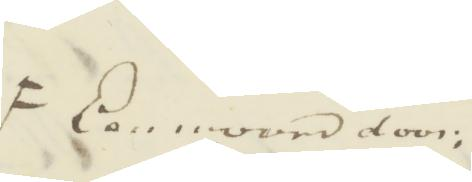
¶ Een woord door:
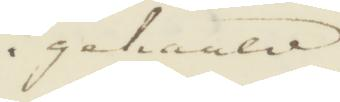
„gehaald
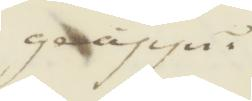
geappr.
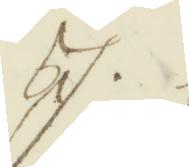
J:S:
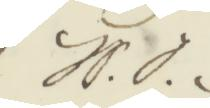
W: V:
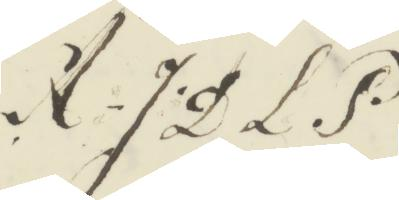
A - Jz LS:
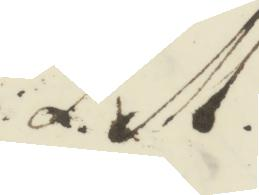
J:L.M
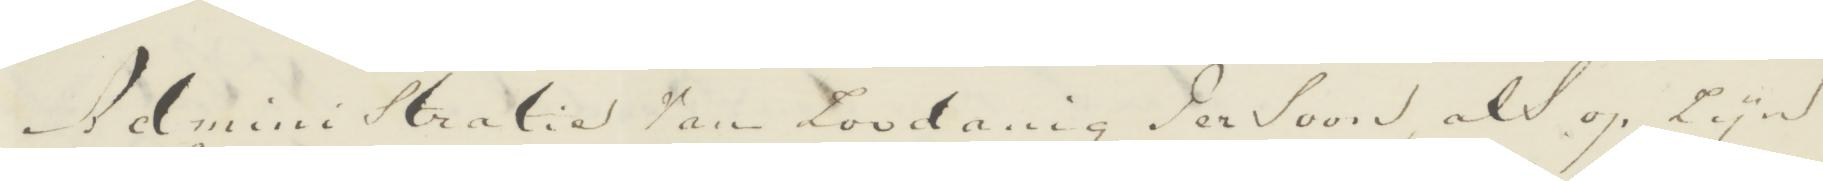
Administratie van zoodanig Persoon, als op zijn
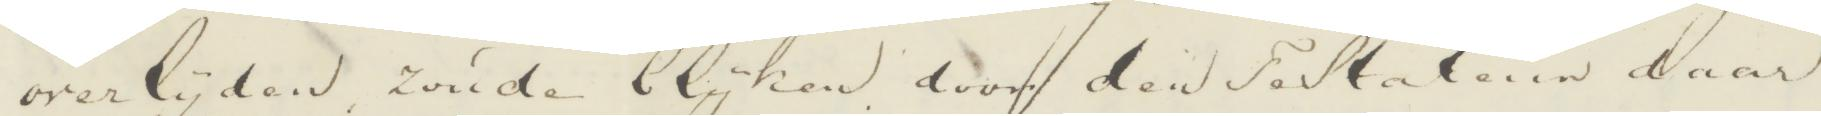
overlijden, zoude blijken, door den Testateur daar
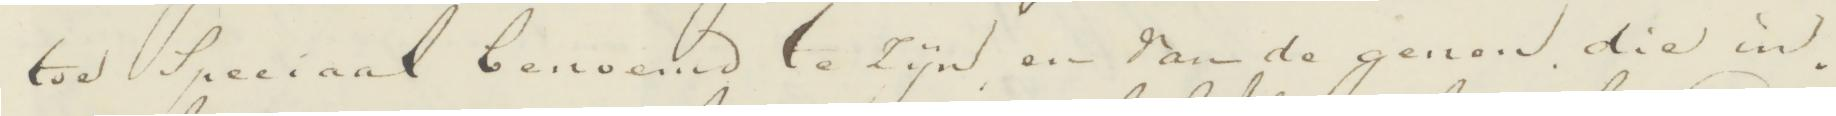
toe speciaal benoemd te zijn, en van de genen, die in„
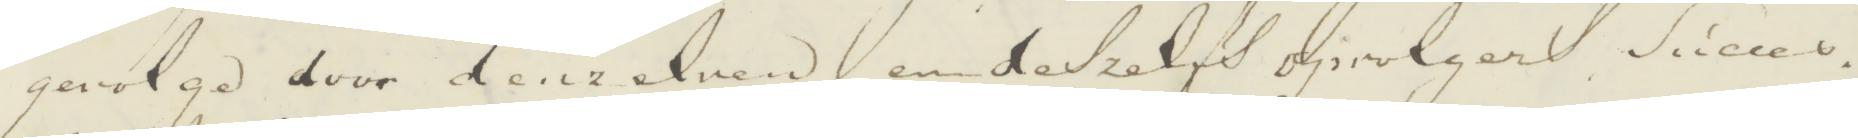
gevolge door denzelven, en deszelfs opvolgers succes„
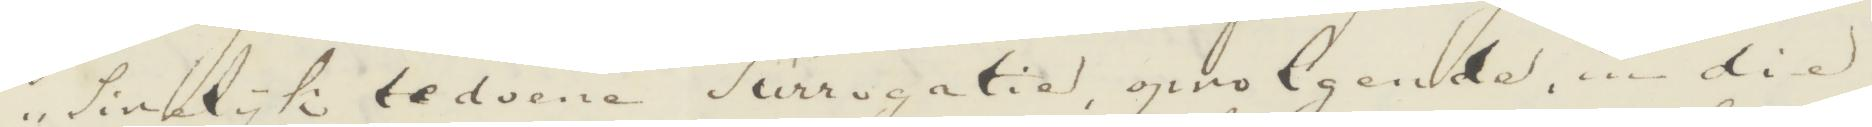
„sivelijk te doene surrogatie, opvolgende, in die
